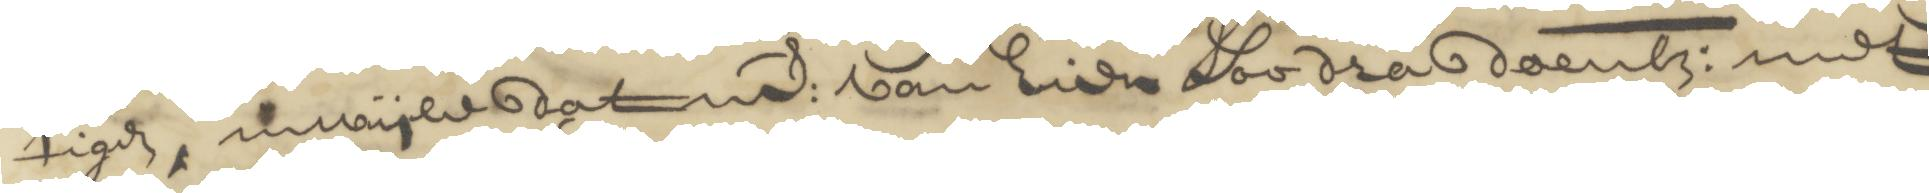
tigen, inwijle dat uE: van hier soodra doenlijk: met
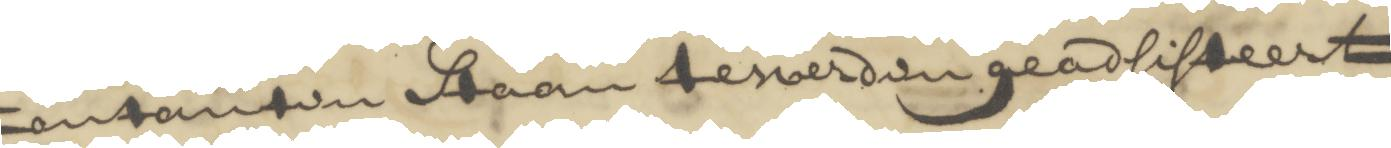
Contanten staan te werden geadsisteert
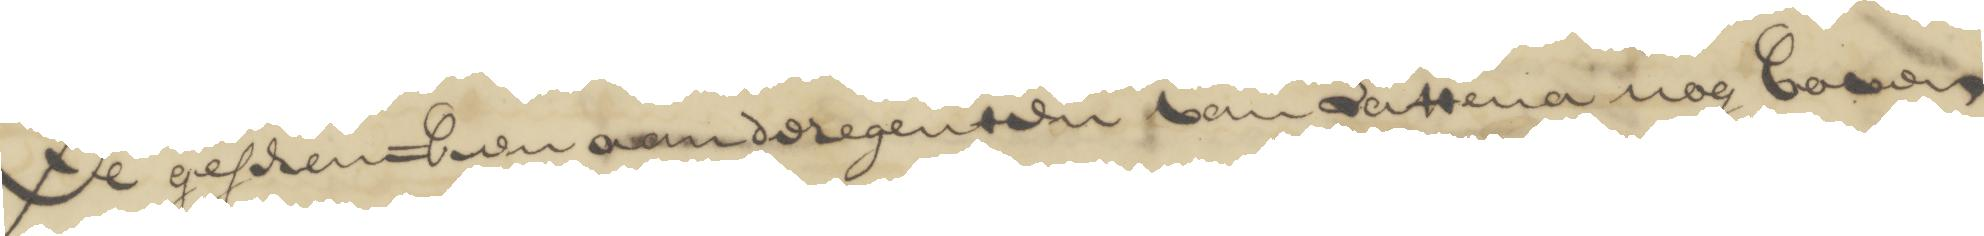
De geschencken aan de regenten van Pattena nog boven
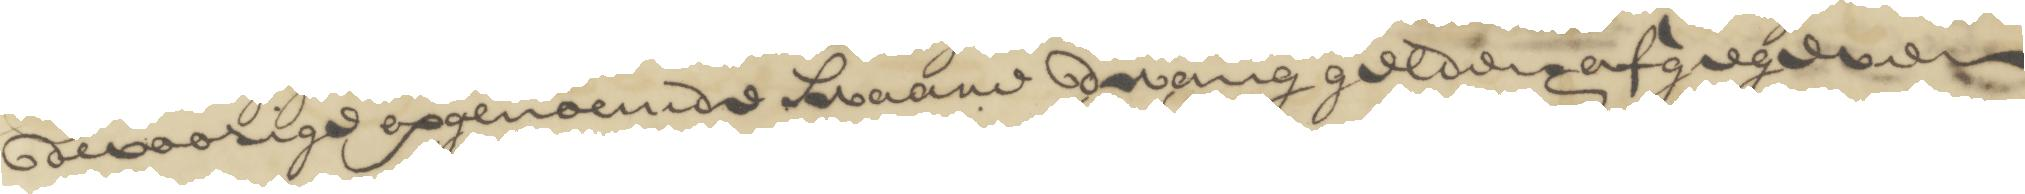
de voorige opgenoemde swaare dwang gelden afgegeven
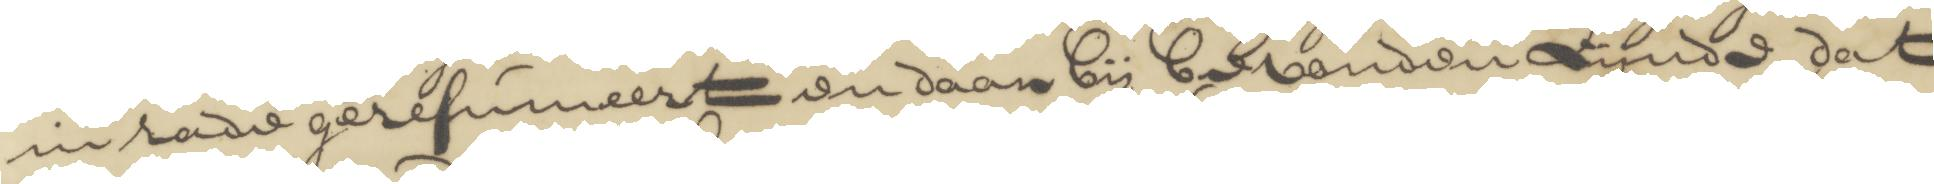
in rade geresumeert en daar bij bevonden zijnde dat
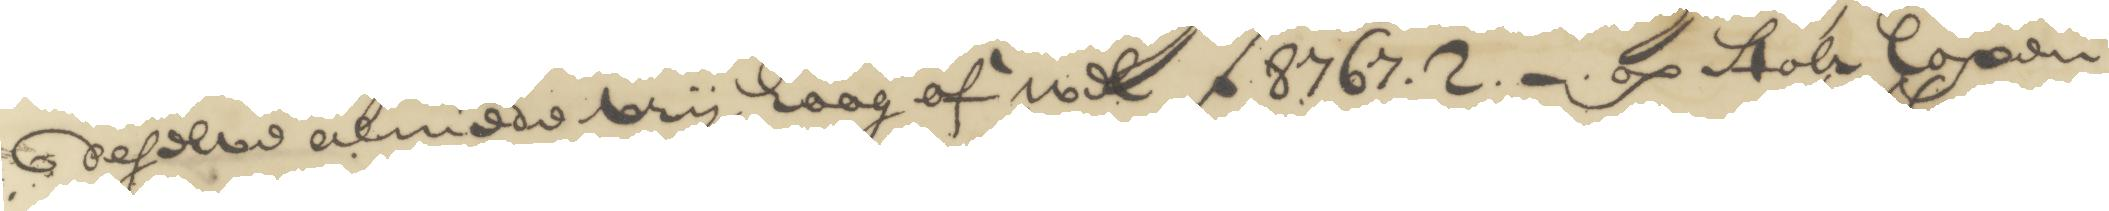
deselve almede vrij hoog of wel ƒ 8767. 2. — op stok lopen
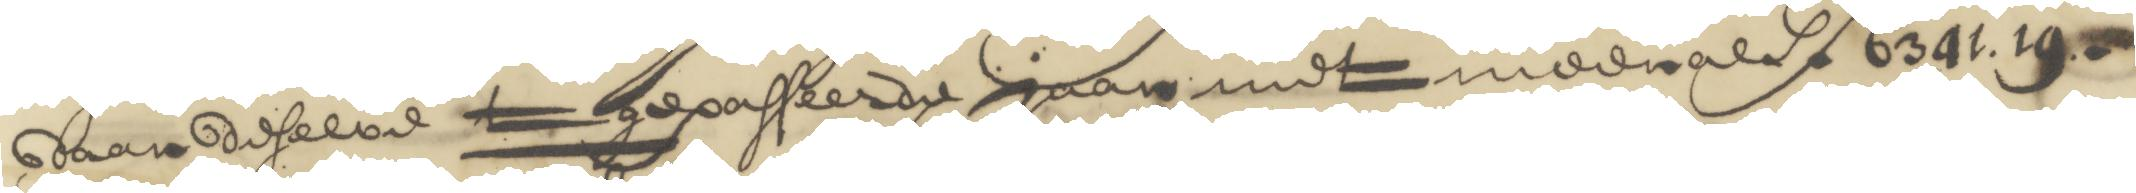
daar deselve 't gepasseerde jaar niet meer als ƒ 6341. 19. —
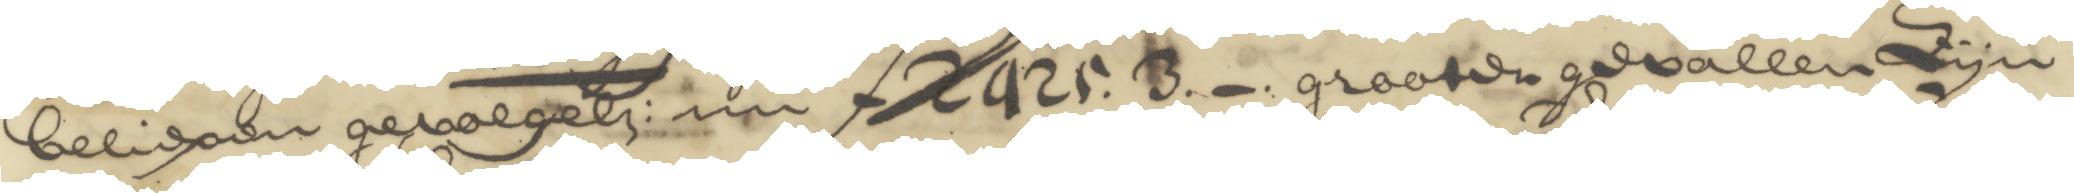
beliepen gevolgelijk: nu ƒ 2425. 3. —. grooten gevallen zijn
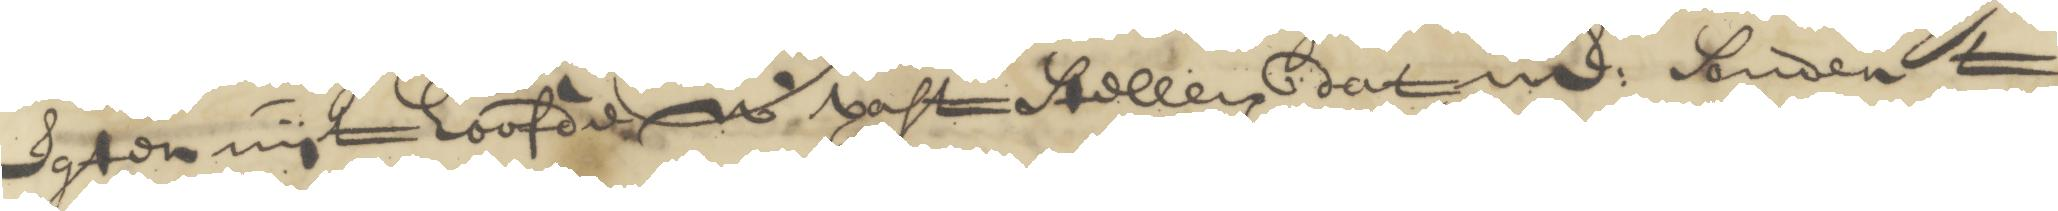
Egter uijt hoofde w' vast stellen dat uE: sonder 't
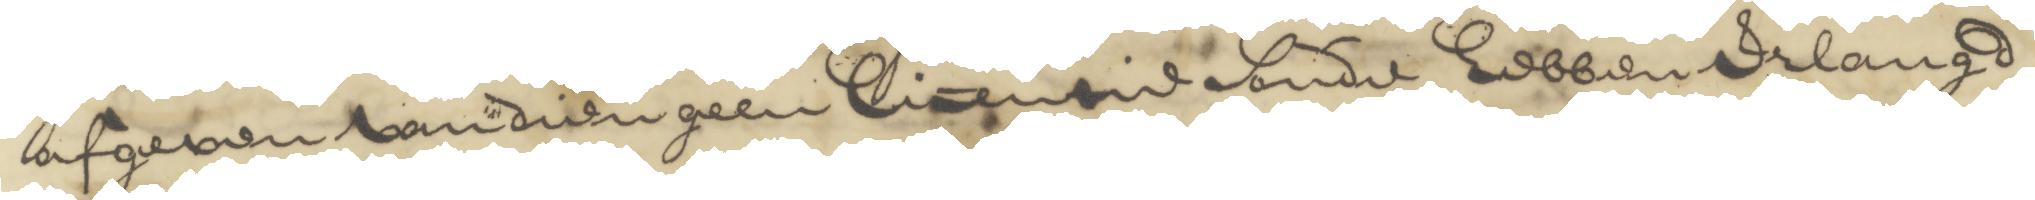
afgeven van dien geen licentie soude hebben Erlangd
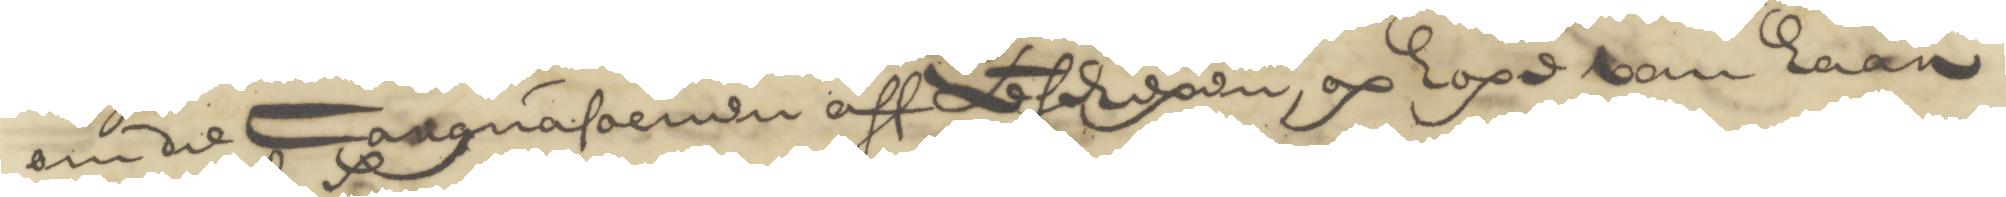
om de Carguasoenen aff teschepen, op hope van haar
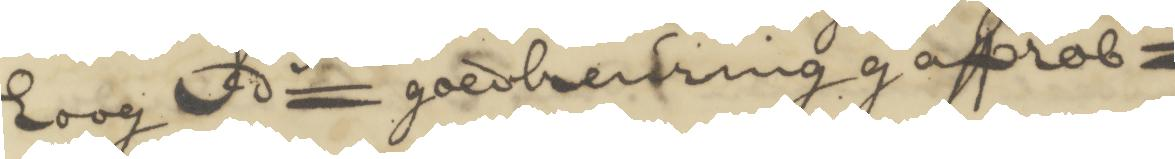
hoog Ed=s goedkeuring g'approb=t
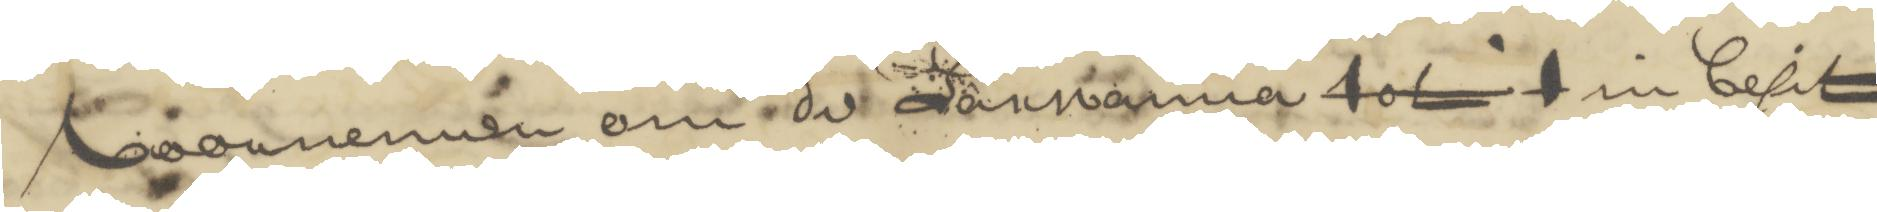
'T Voornemen om de Parwanna tot ’t in besit
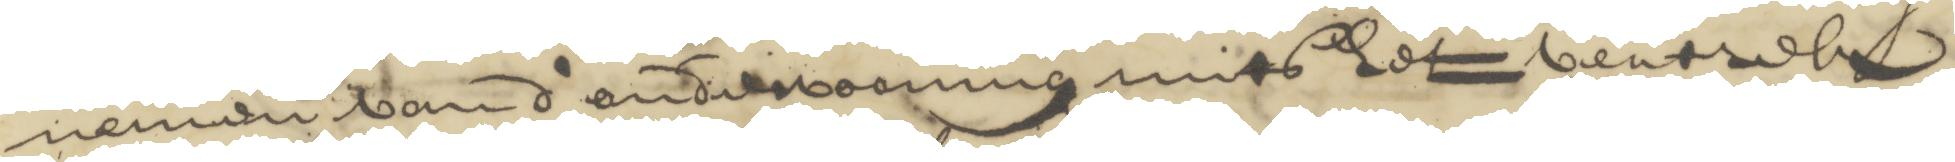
nemen van d’oude wooning mits het vertrek
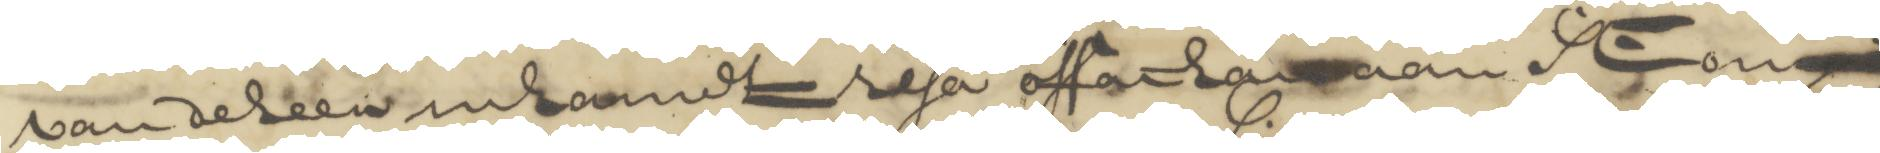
van de heer inhamet resa offachan aan 's Comp=s
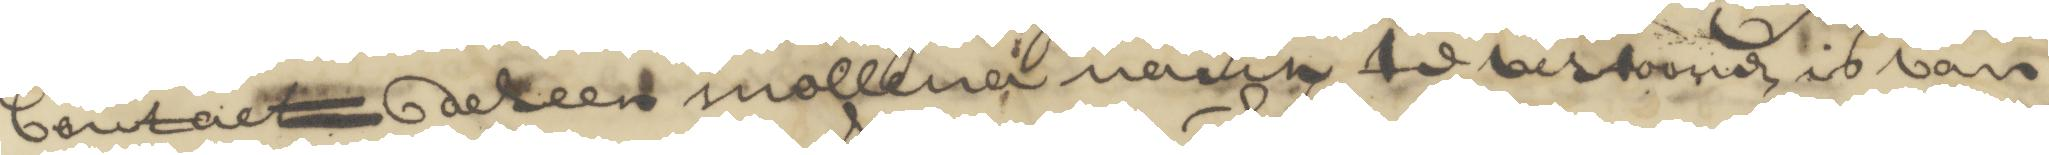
boutaet de heer mollena nasir te vertoonen is van
